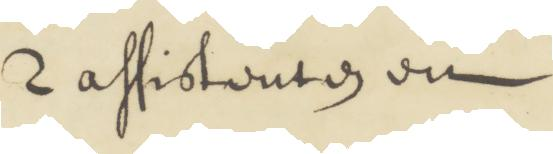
2 assistenten en
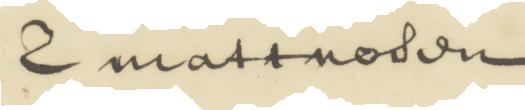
2 mattrosen
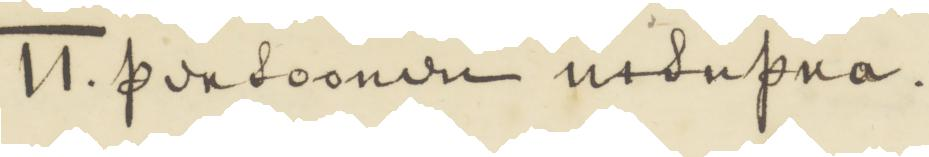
11. persoonen ut supra.
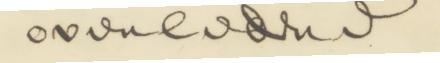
overledene
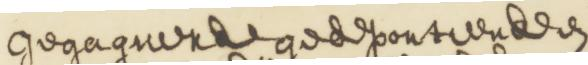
gegaguerde gedeporteerde en
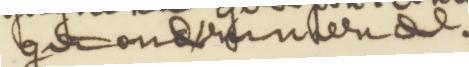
gecondemneerde.
